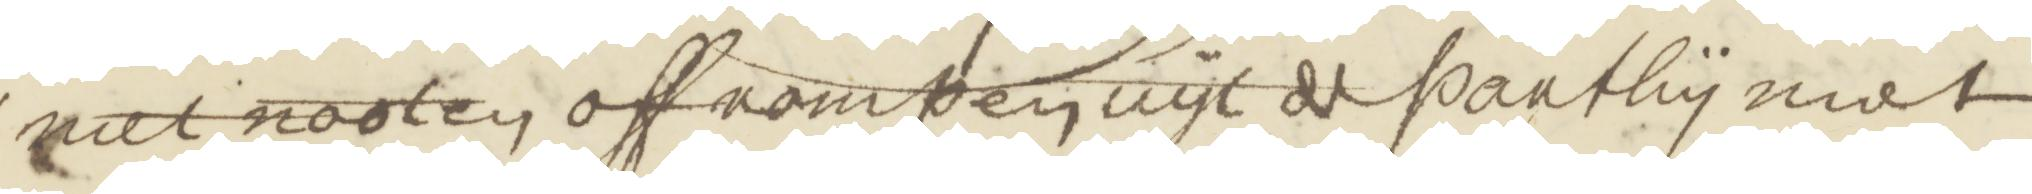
met nooten off rompen uijt de parthij met
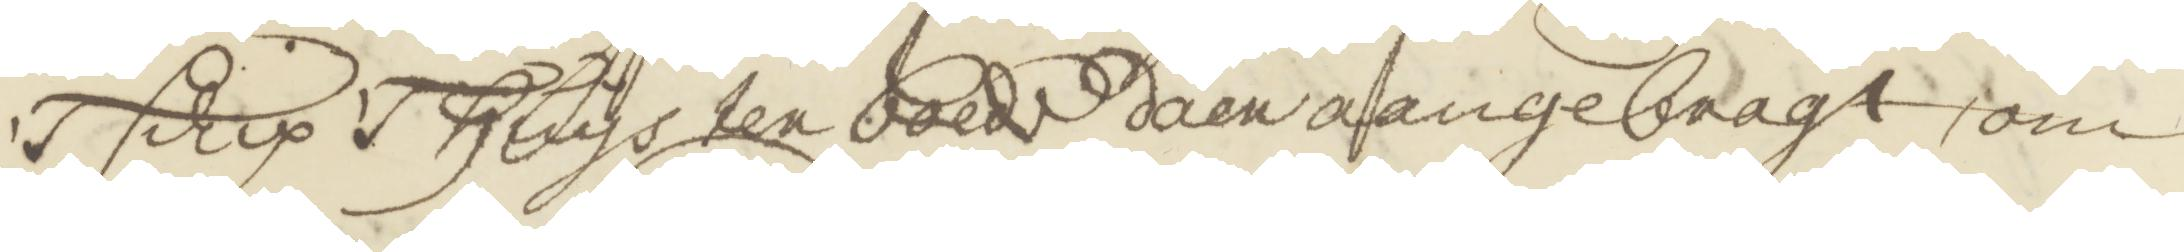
'T schip 'Thuijs ter boede daer aangebragt, om
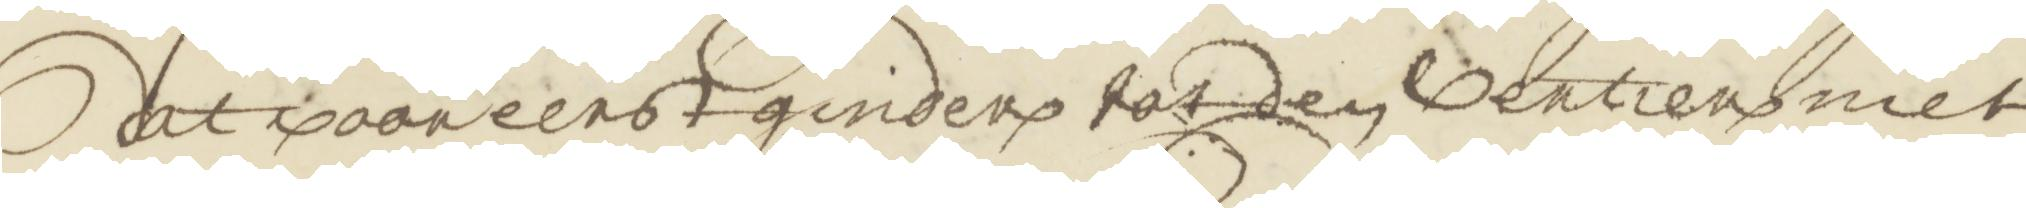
dat voor eerst ginder tot den vertier niet
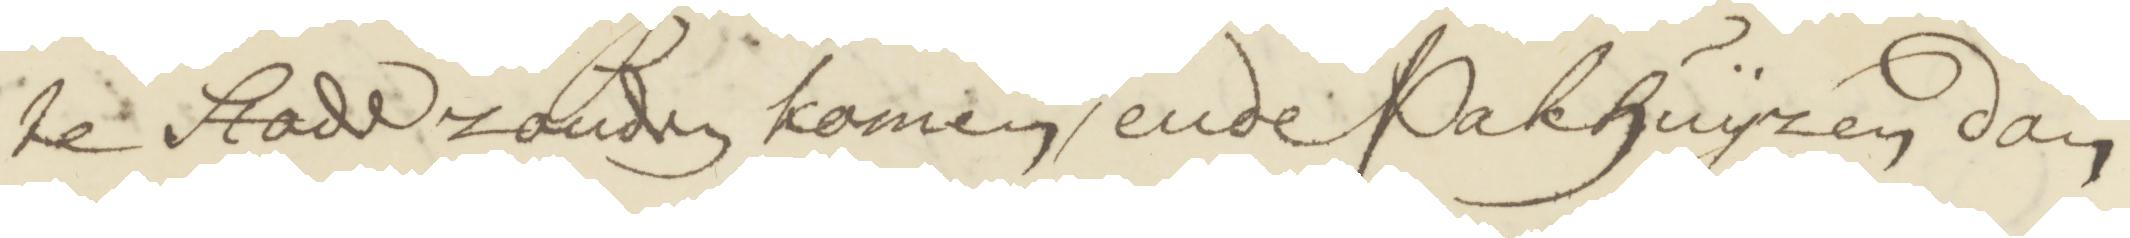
te stade zouden komen, ende Pakhuijzen dan
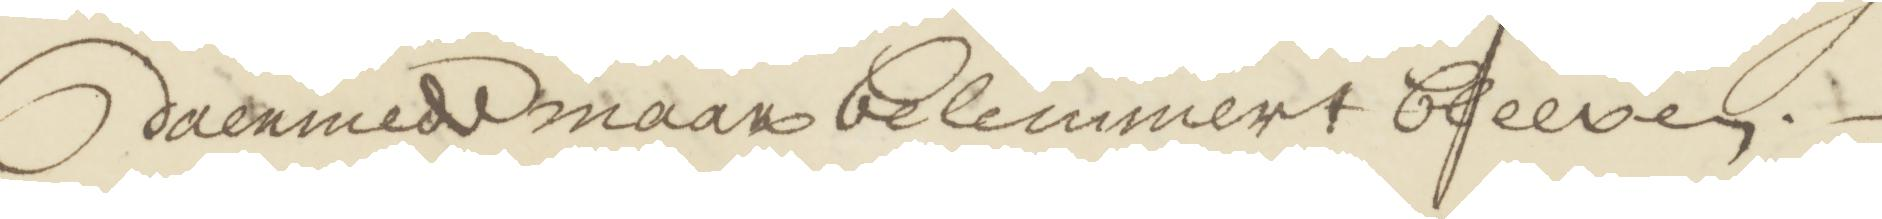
daer mede maar belemmert bleeven. -
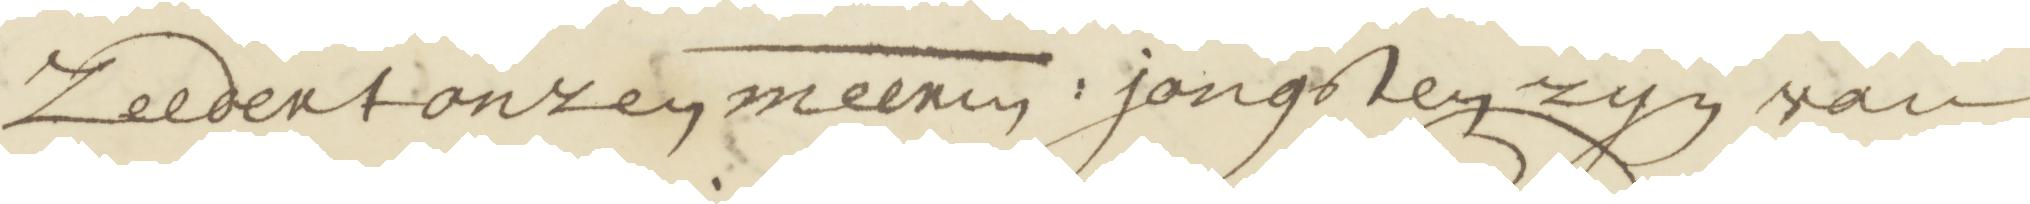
zeedert onzen meerm: jongsten zijn van
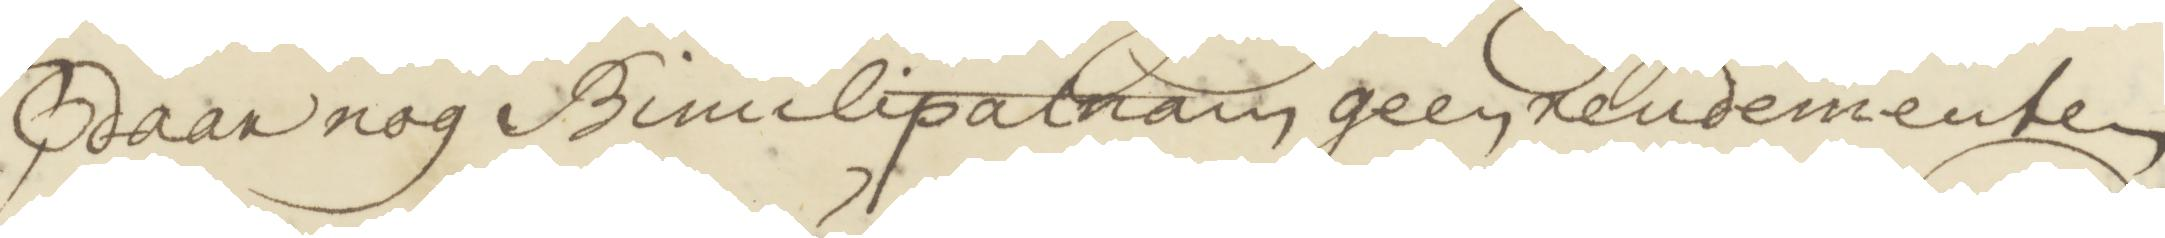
daar nog Bimilipatnam geen rendementen
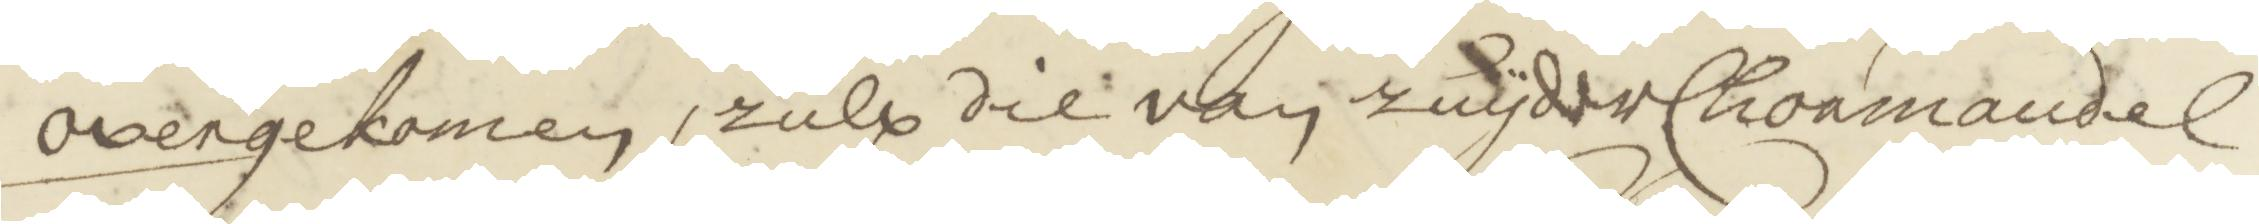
overgekomen, zulx die van zuijder Chormandel
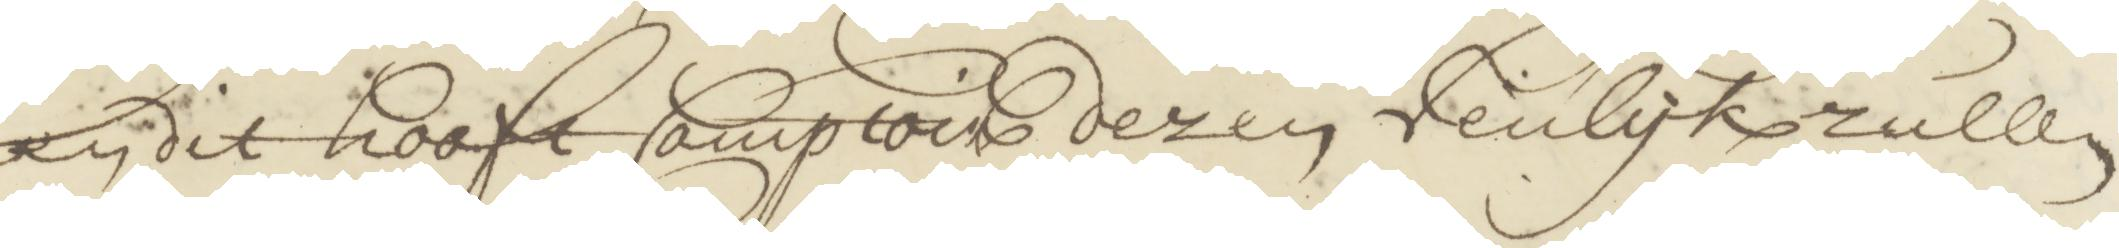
en dit hooft Comptoir dezen Eenlijk zullen
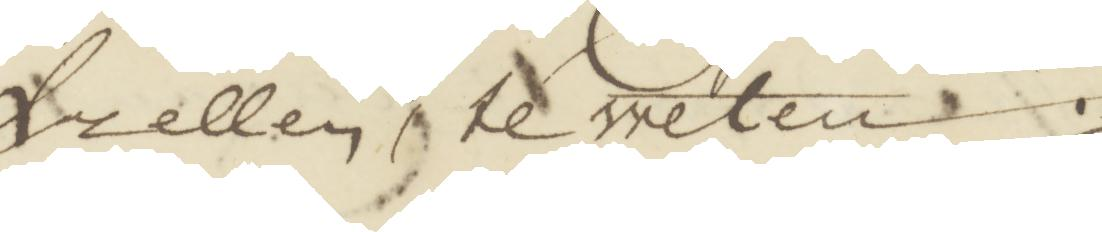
verzellen te weten.
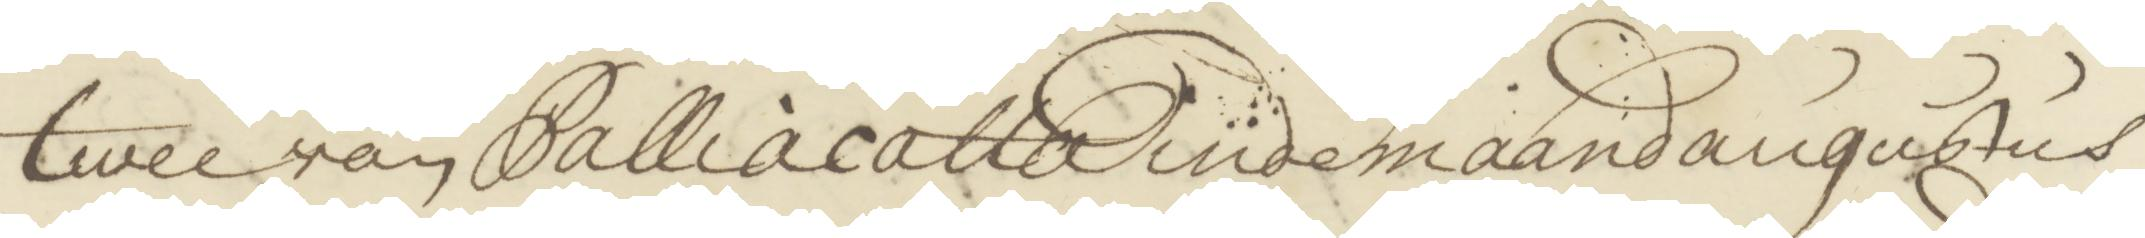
twee van Palliacatia in de maand augustus
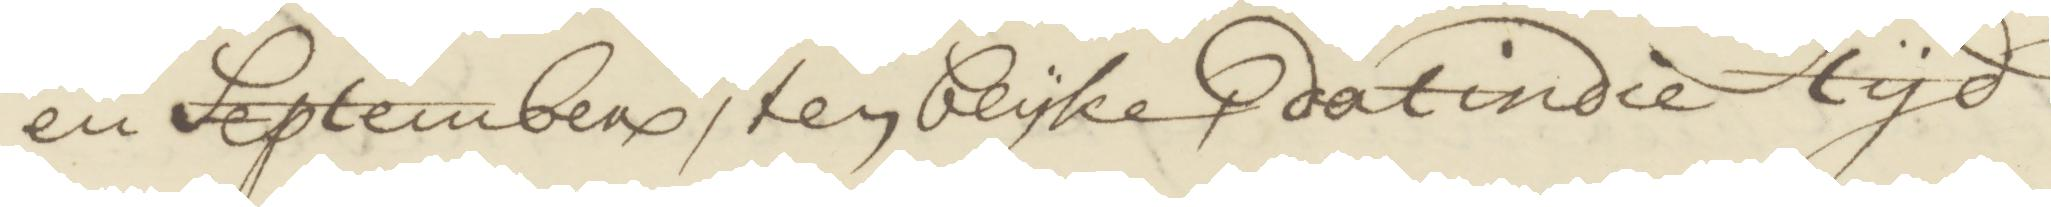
en September, ten blijke, dat in die tijd
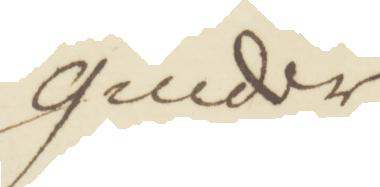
ginder
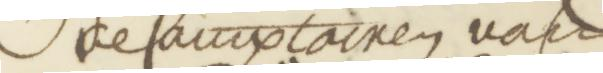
de Comptoiren van
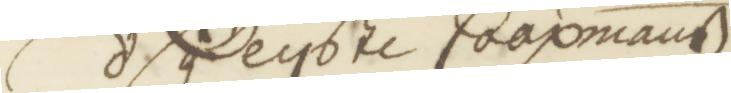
d' g' eijste Coopmans
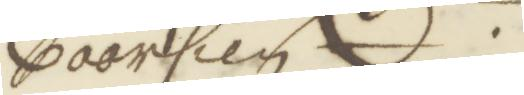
voorsien —.
